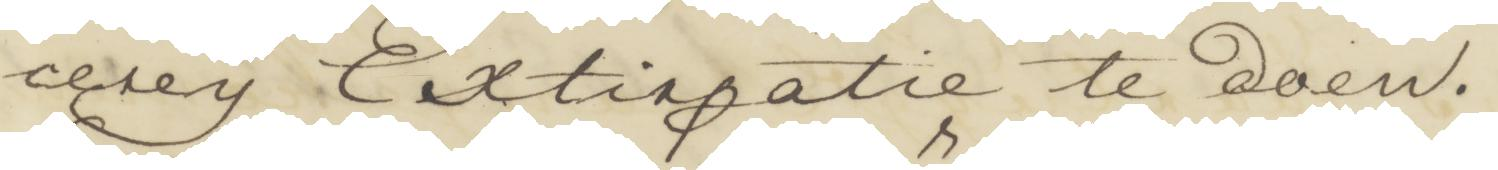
cereij Extirpatie te doen.
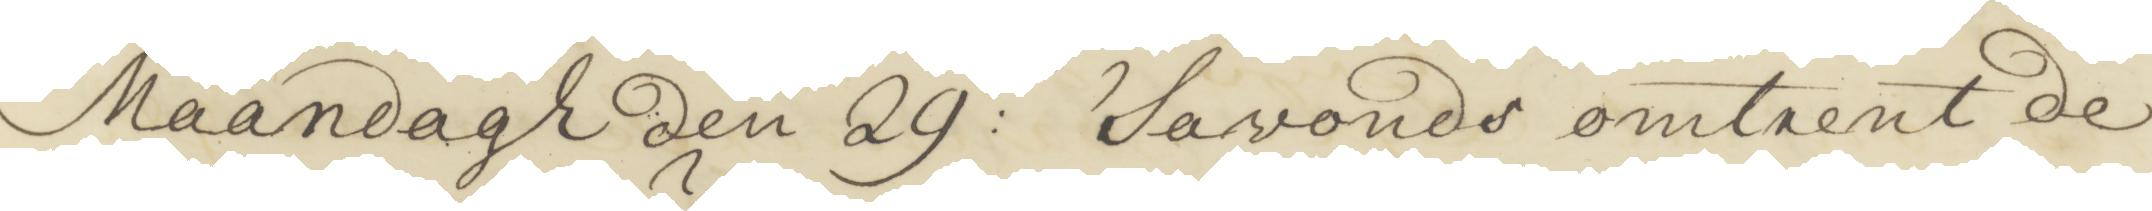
Maandagh den 29:' 'savonds omtrent de
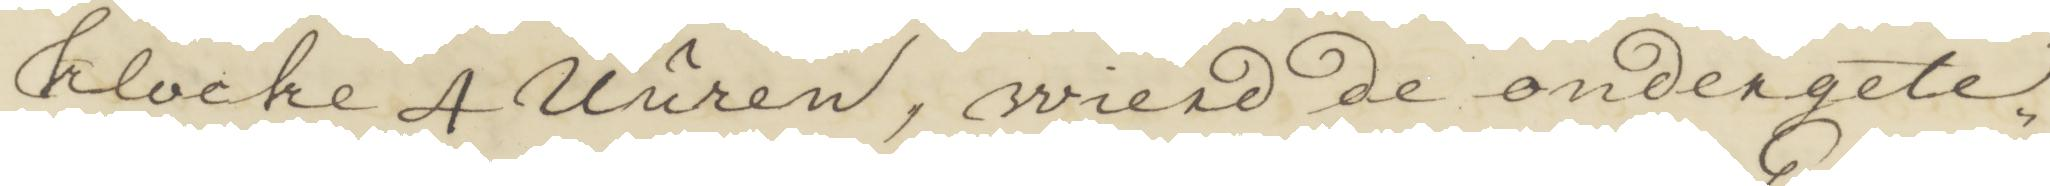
klocke 4 Uuren, wierd de ondergete„
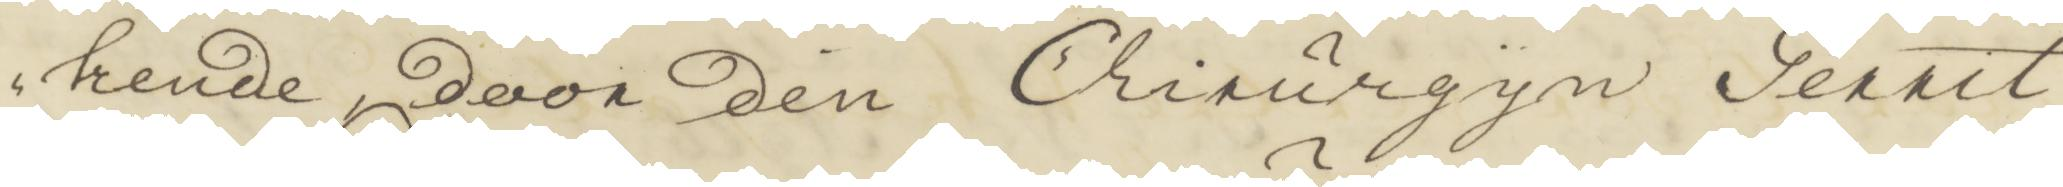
„kende, door den Chirurgijn Gerrit
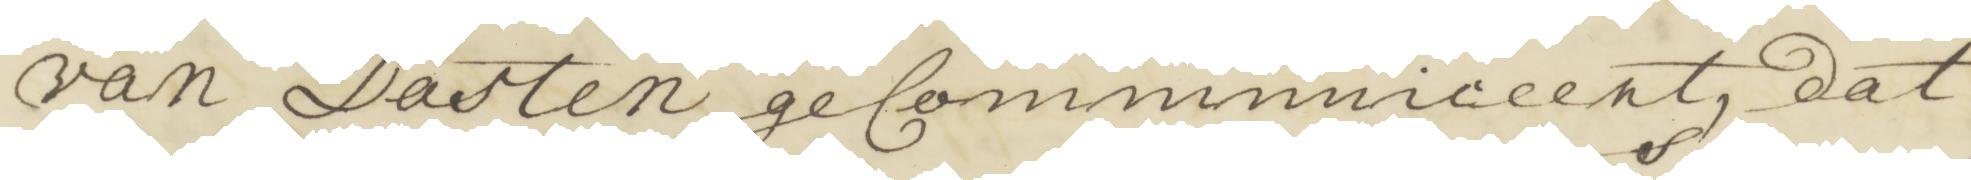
van Dasten gecommuniceert, dat
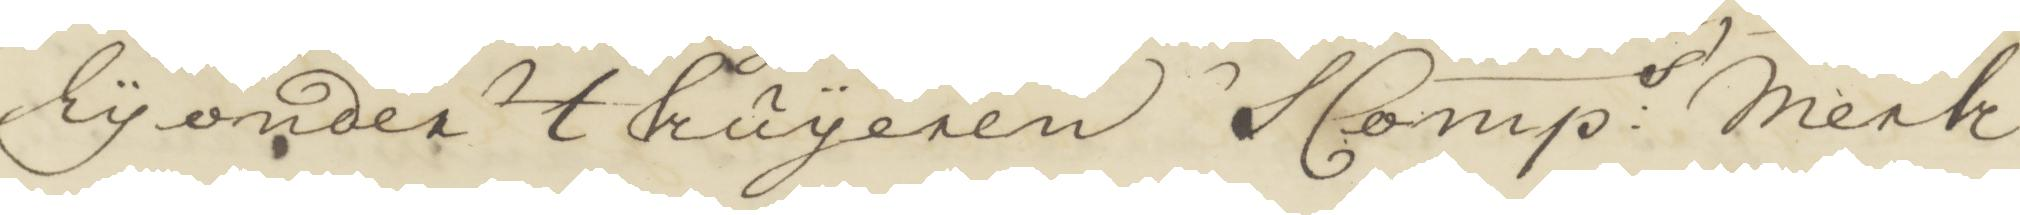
hij onder ’t kuijeren ’s Comp:s merk
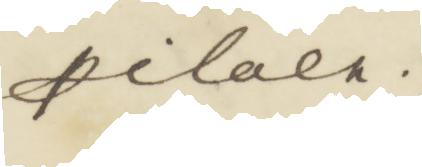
pilaer.
